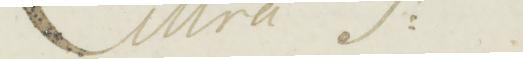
Littra F:
